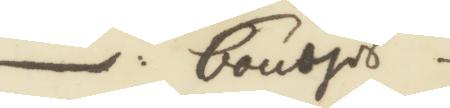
_:o boutjes
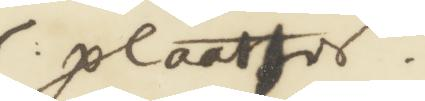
_: plaatjes .
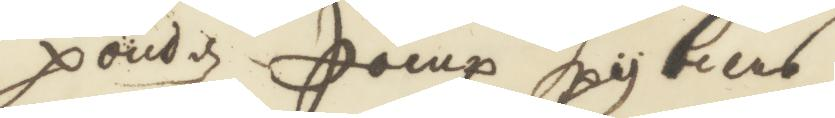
ponden pomp spijkers
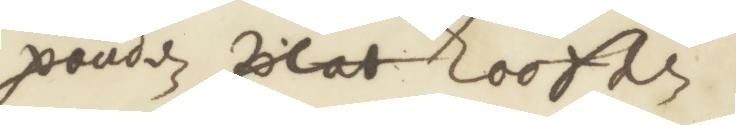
ponden plat hoofden
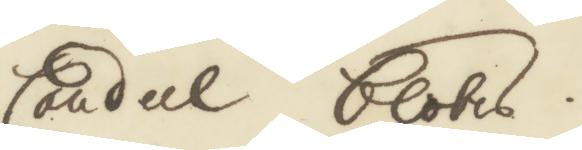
Cardeel bloks
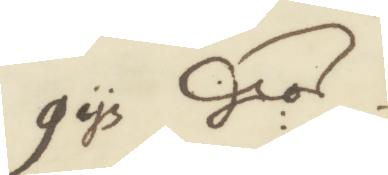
gijn d:os
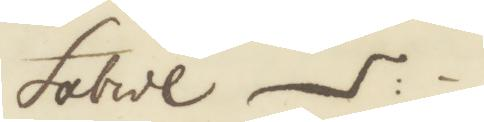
takel _:o
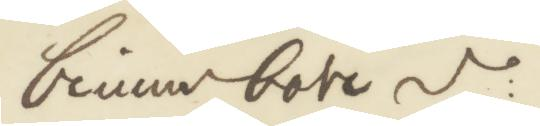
kinne bok _:o
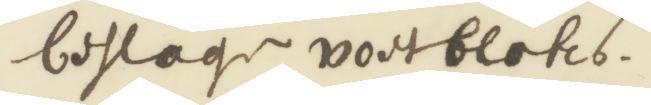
beslage voet bloks -
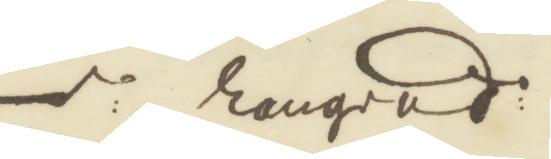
_:o hanger d:o
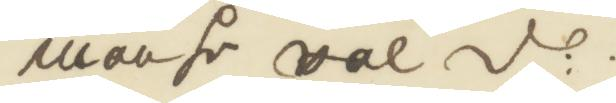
marse val d:o
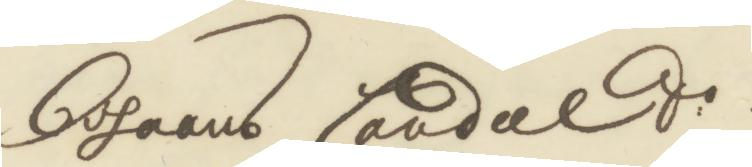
besaans Cardeel d:o
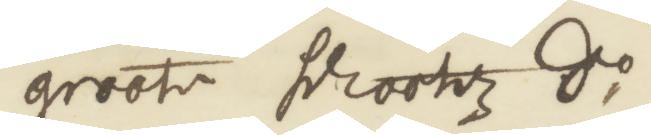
groote schooten d„o
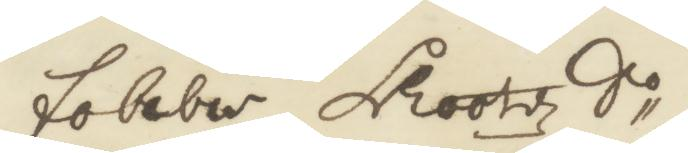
fokke schooten d„o
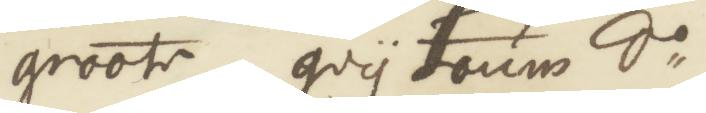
groote geij touw d„o
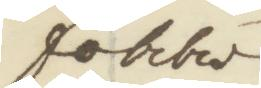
fokke
